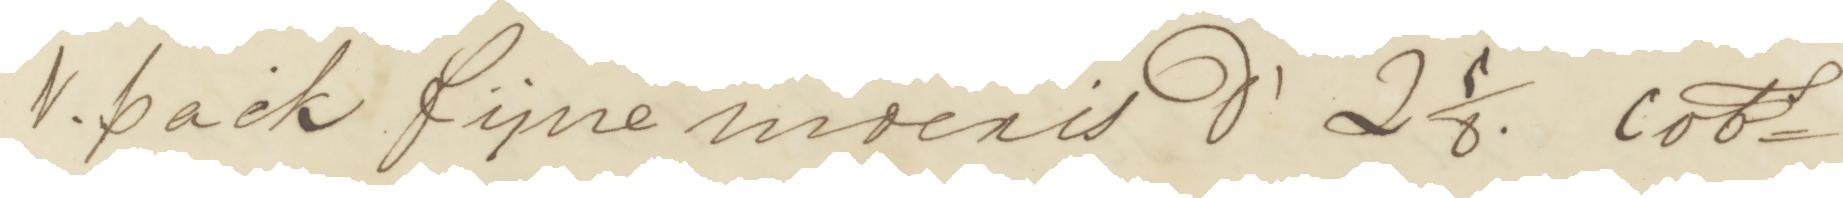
1. pack fijne moeris d’ 2 5/8. cob=s
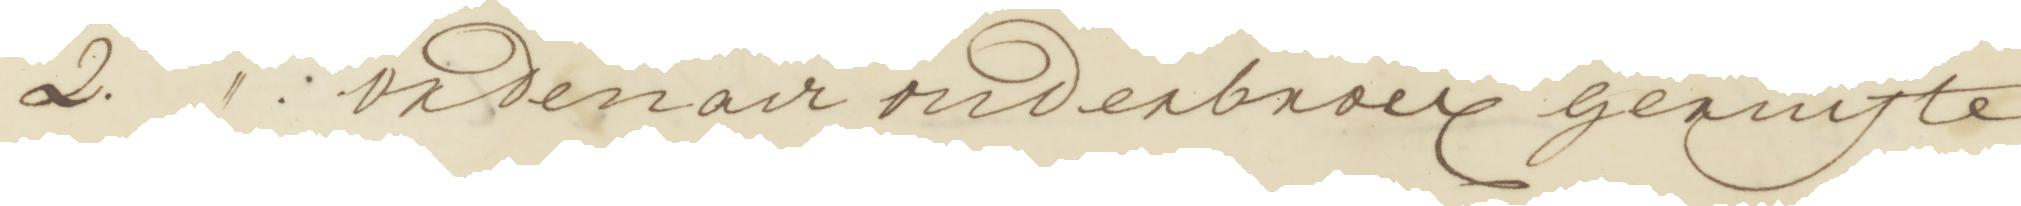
2. „: ordenair onderbroex geruijte
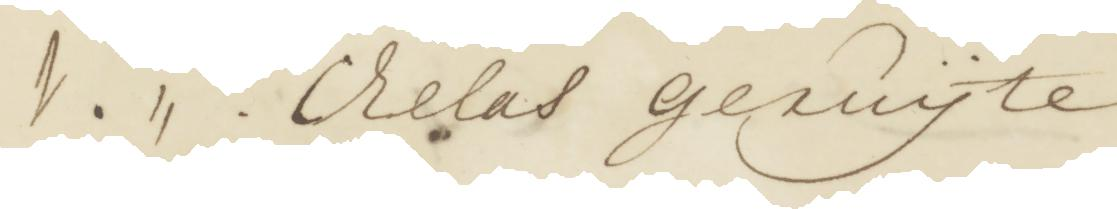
1. „ . Chelas geruijte
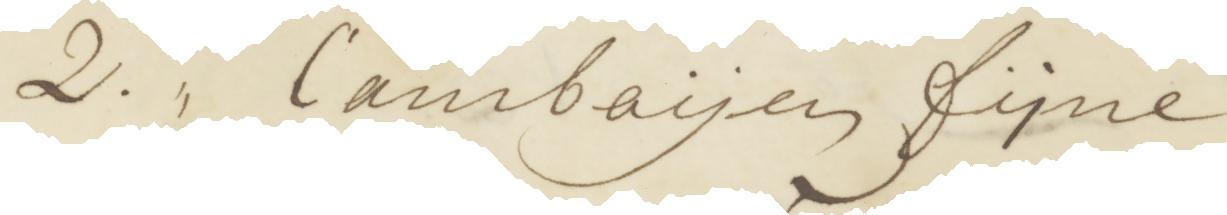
2. „ Cambaijen fijne
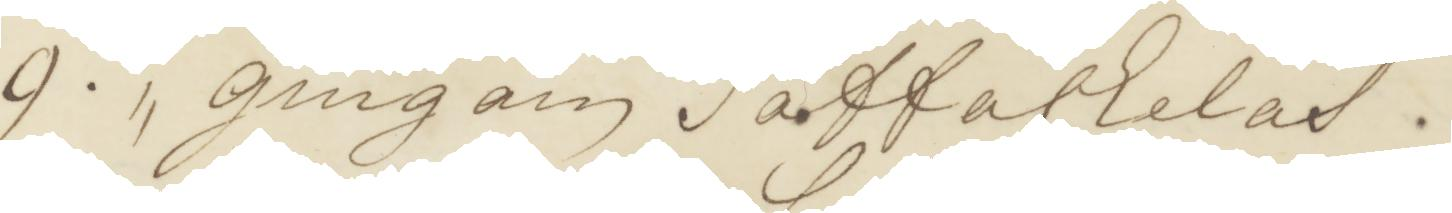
9. „ gingam Taffachelas.
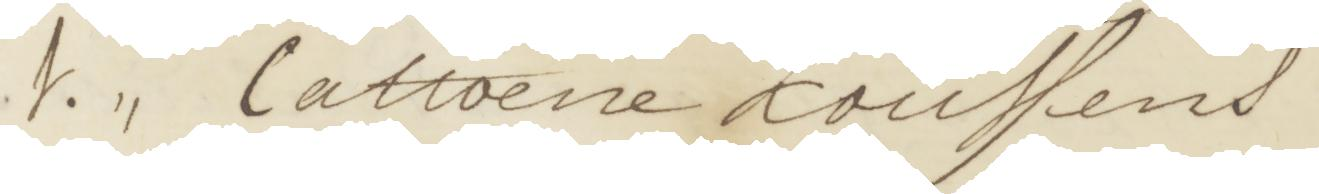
1. „ cattoene koussens
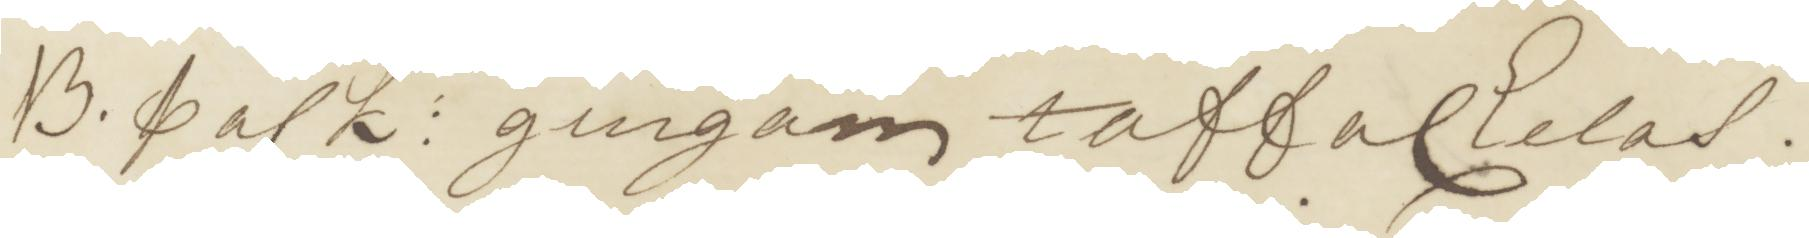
13. pack: gingam taffachelas.
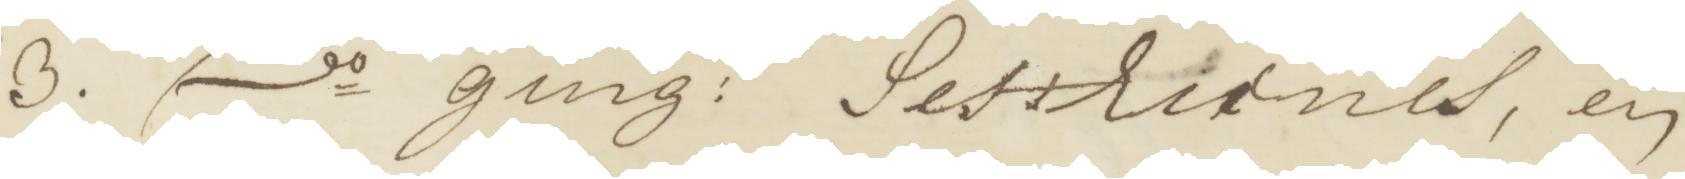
3. _=o ging: Sesthienes, en
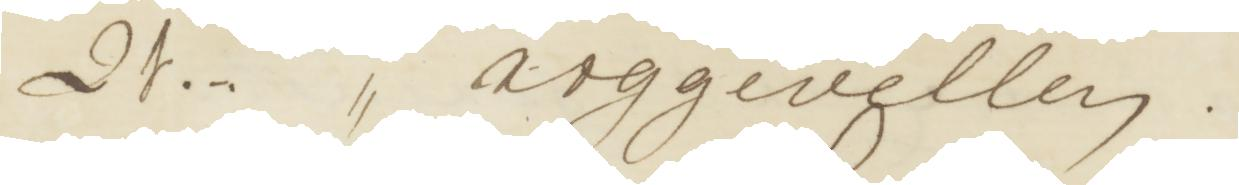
21.-. „ roggevellen.
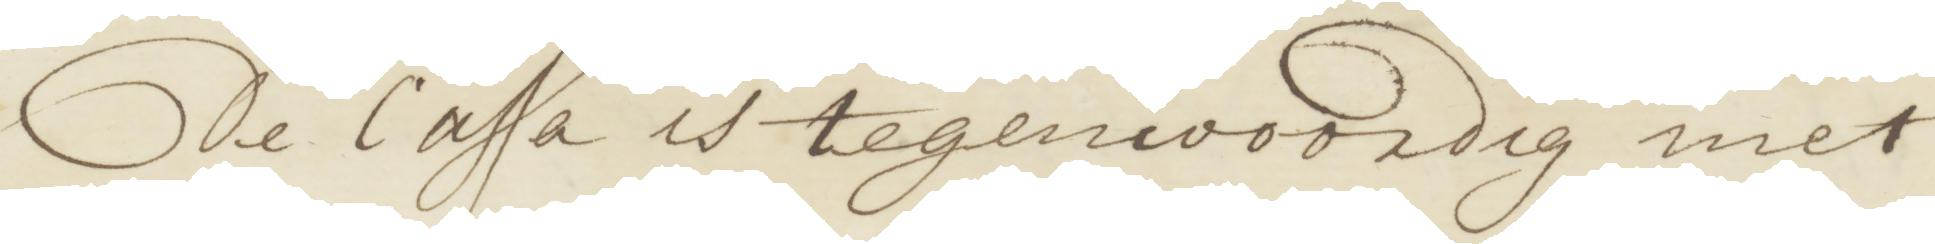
de Cassa is tegenwoordig met
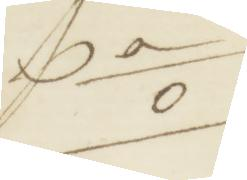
p a/o
